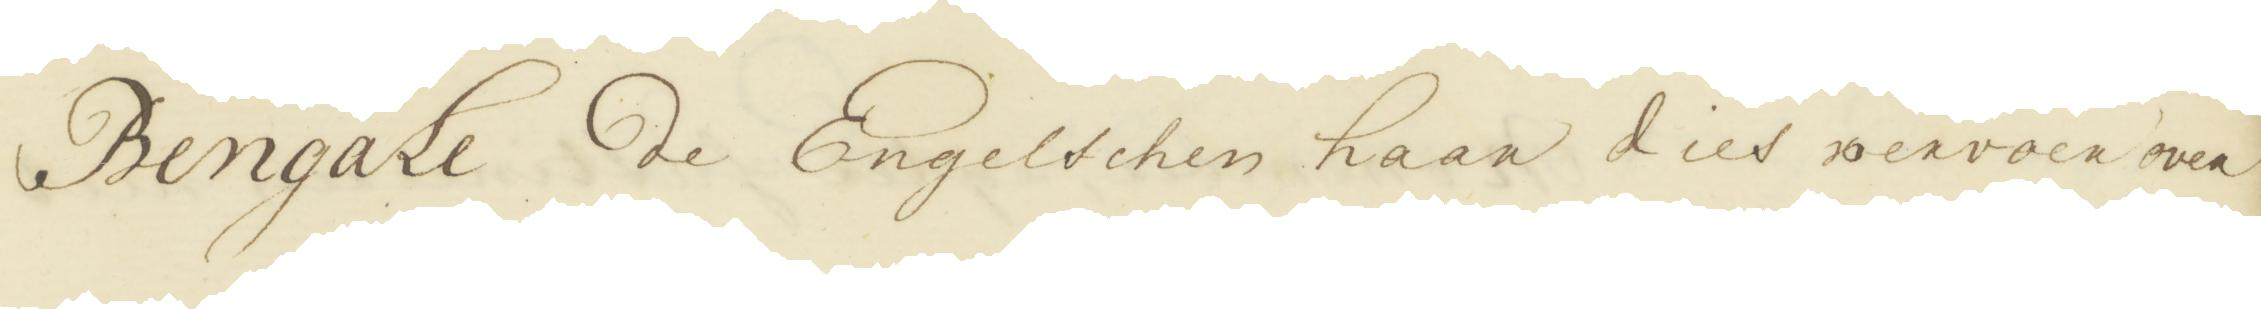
Bengale de Engelschen haar dies vervoer over
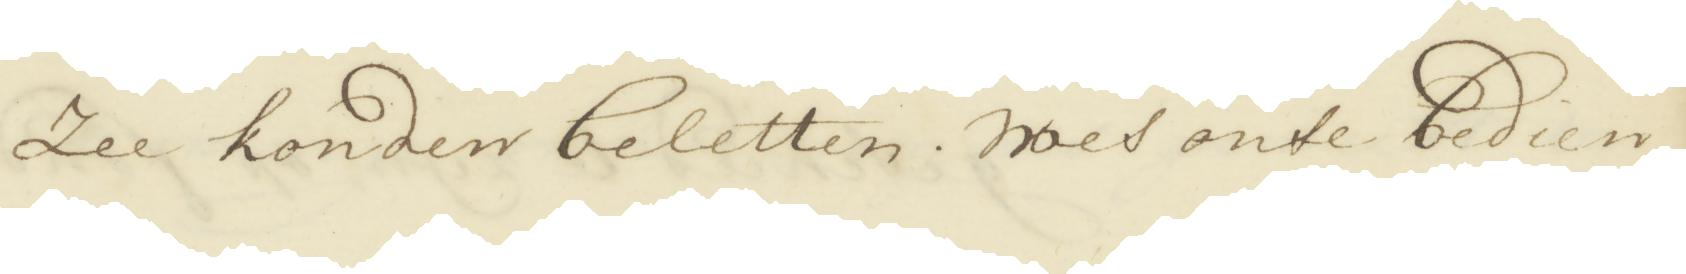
zee konden beletten. wes onse bedien=
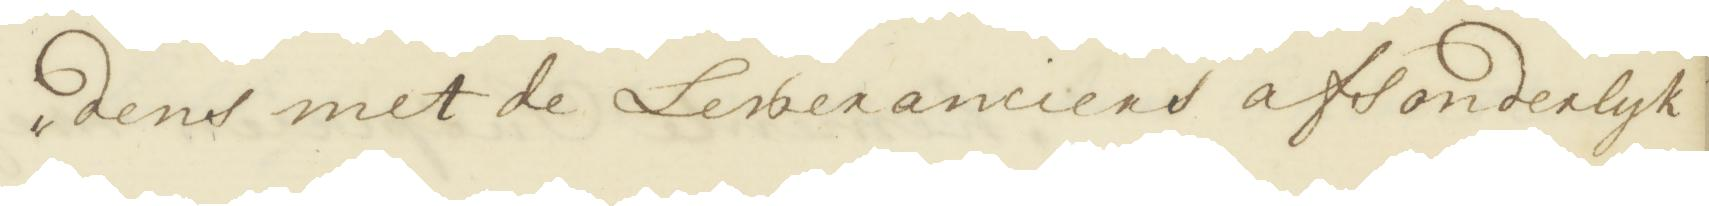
„dens met de leveranciers afsonderlyk
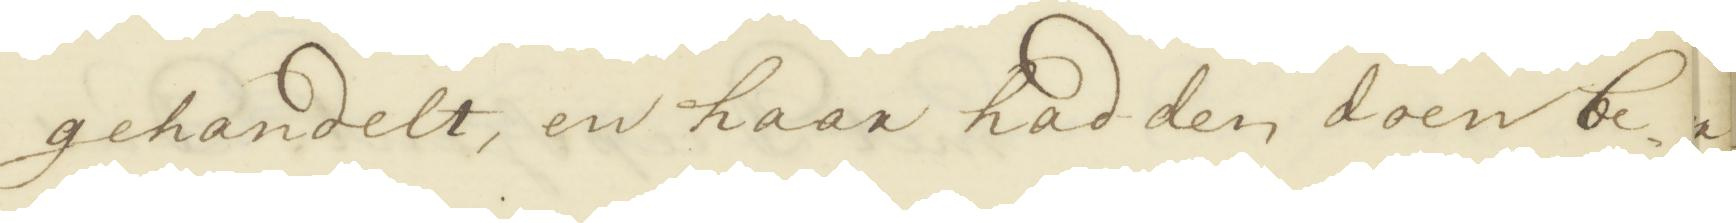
gehandelt, en haar hadden doen be,
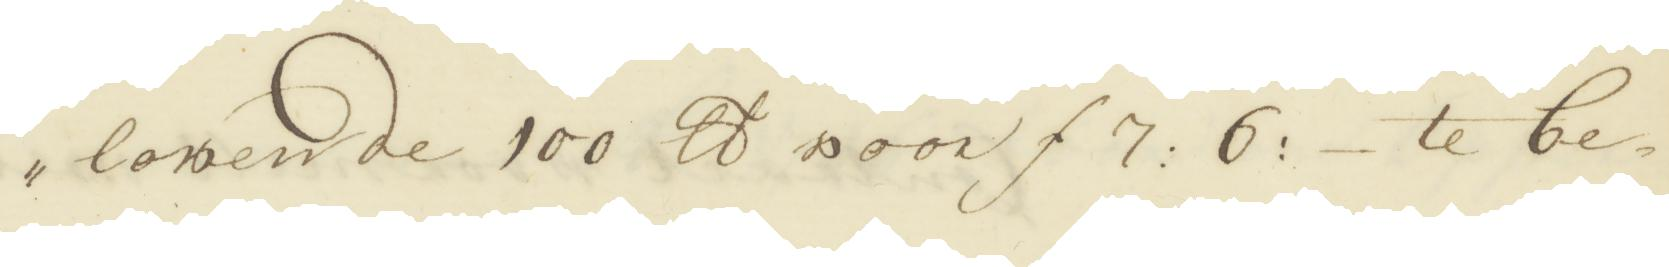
„lovende 100 lb voor ƒ7: 6:— te be=
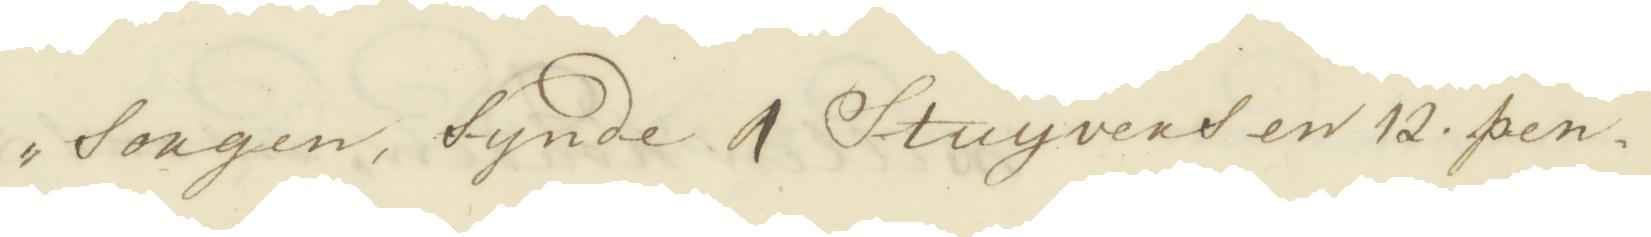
„sorgen, synde 4 Stuyvers en 12. pen,
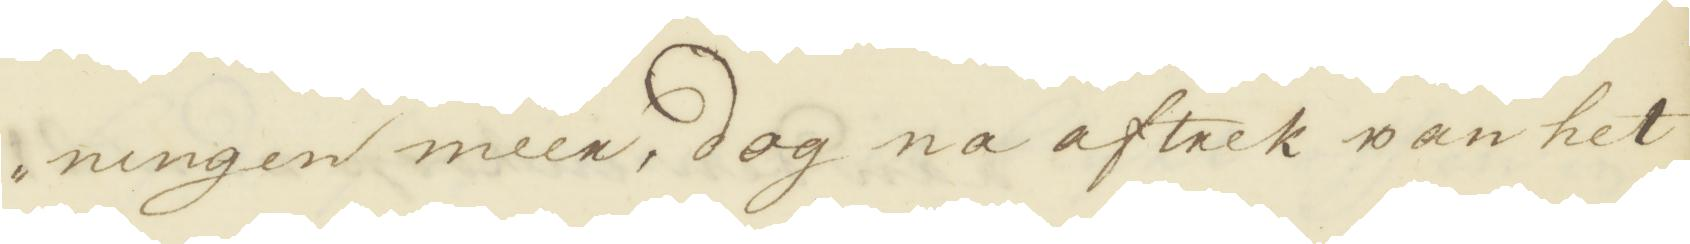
„ningen meer, dog na aftrek van het
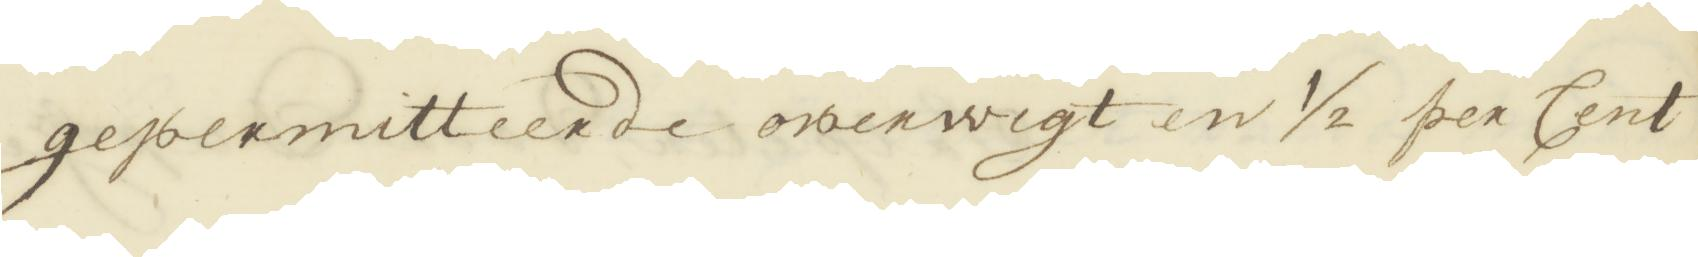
gepermitteerde overwigt en ½ per Cent
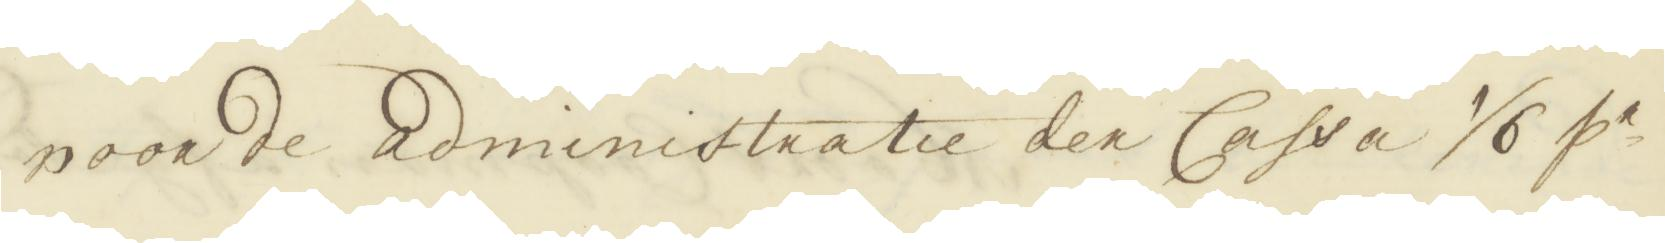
voor de administratie der Cassa 1/6 p=r
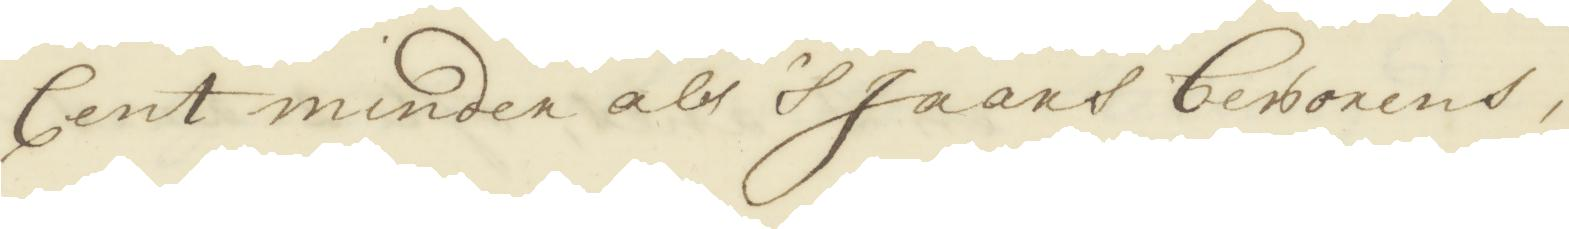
Cent minder als 's jaars bevorens,
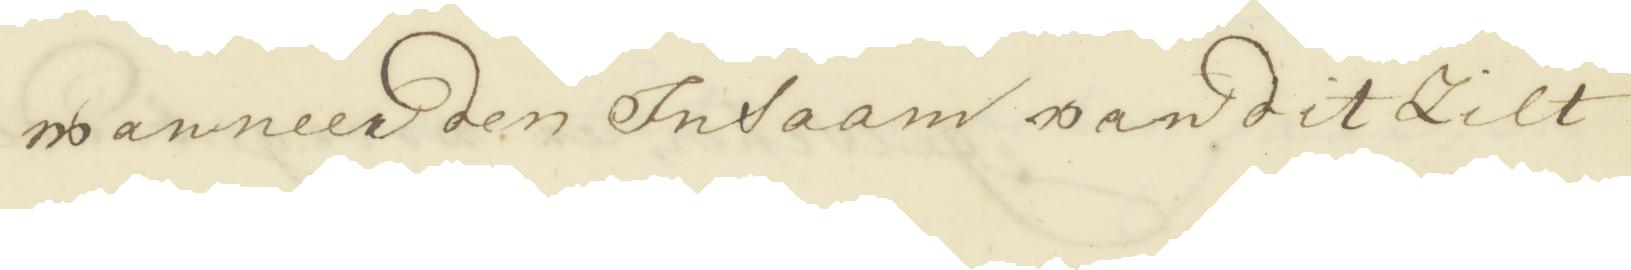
wanneer den Insaam van dit Zilt
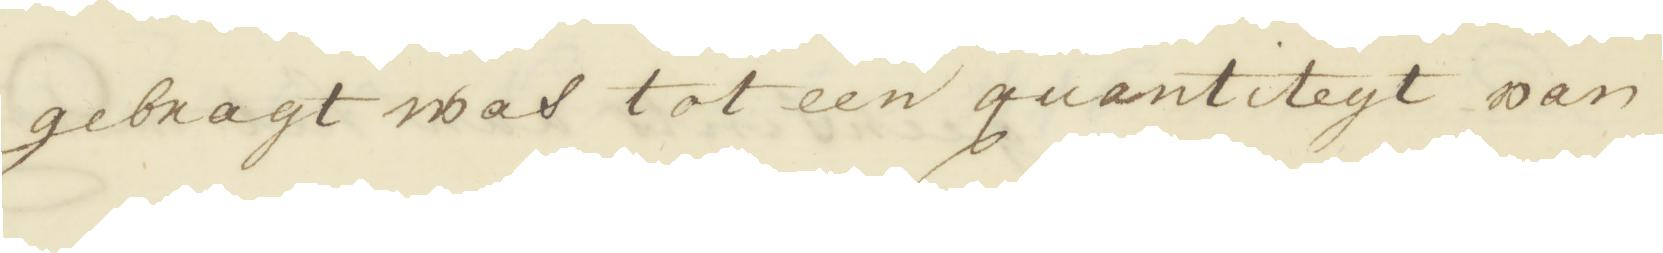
gebragt was tot een quantiteyt van
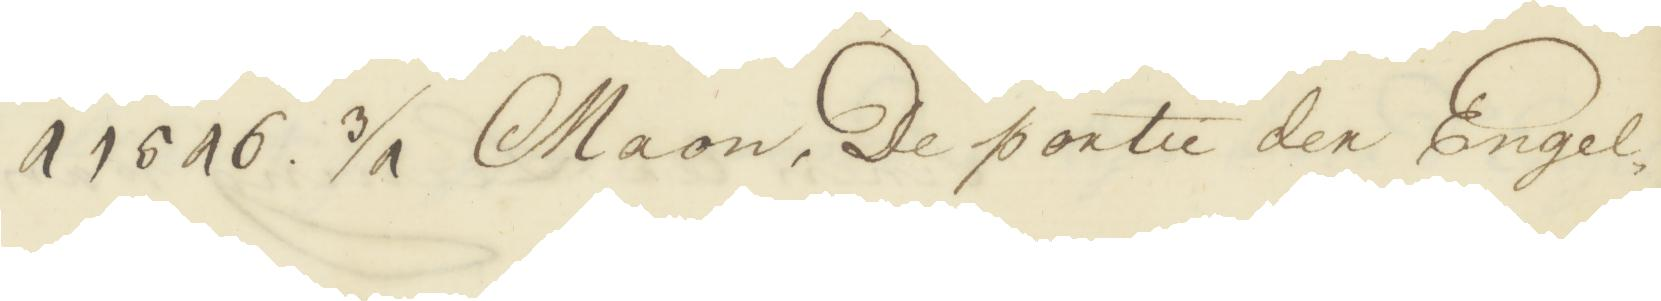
41546. ¾ Maon, De portie der Engel,
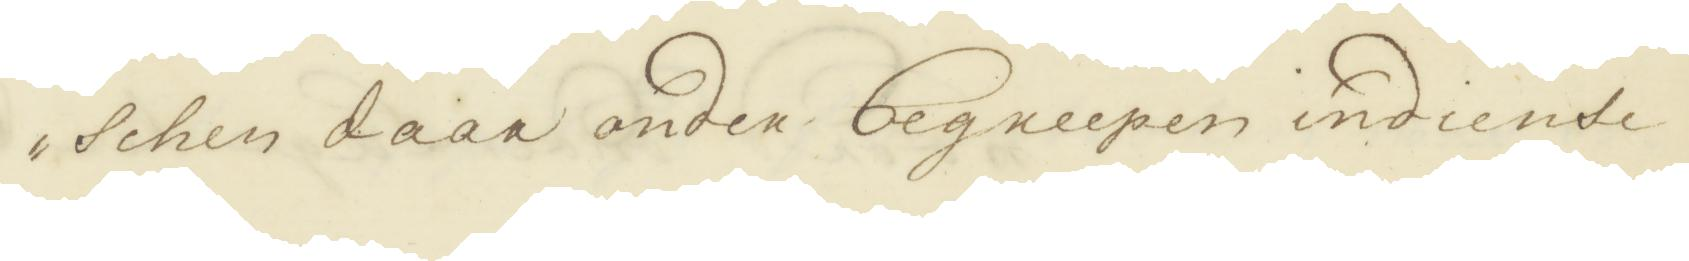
„schen daar onder begreepen indiense
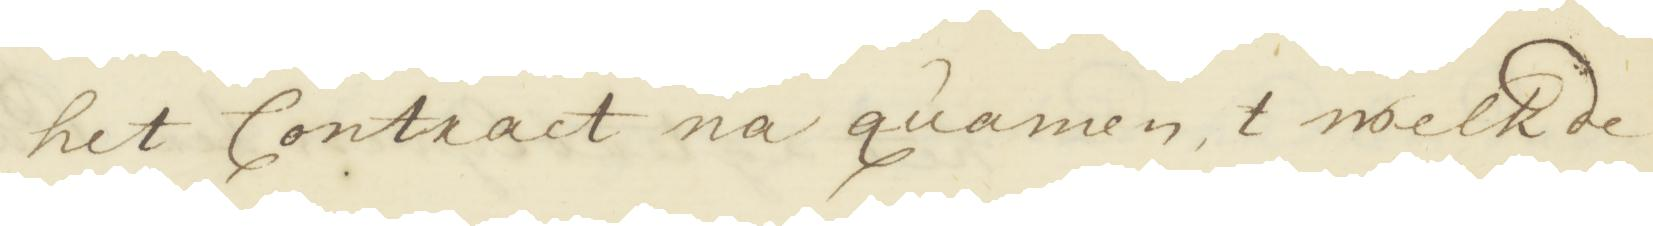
het Contract na quamen, t welk de
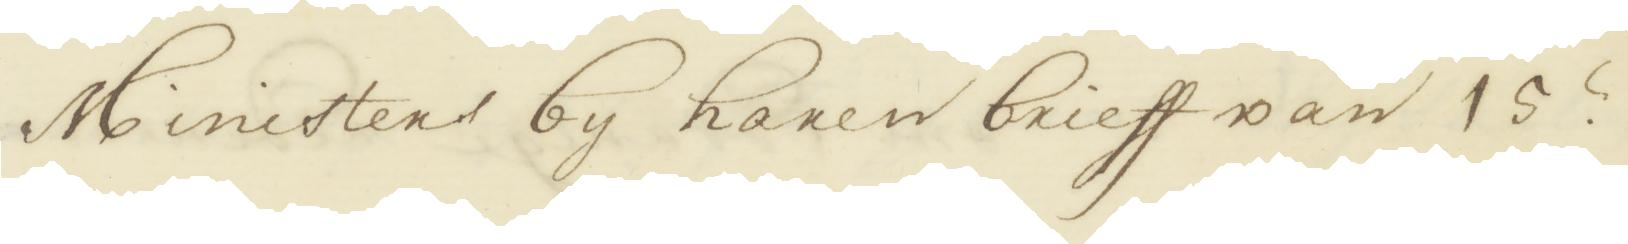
Ministers by haren brieff van 15:'
